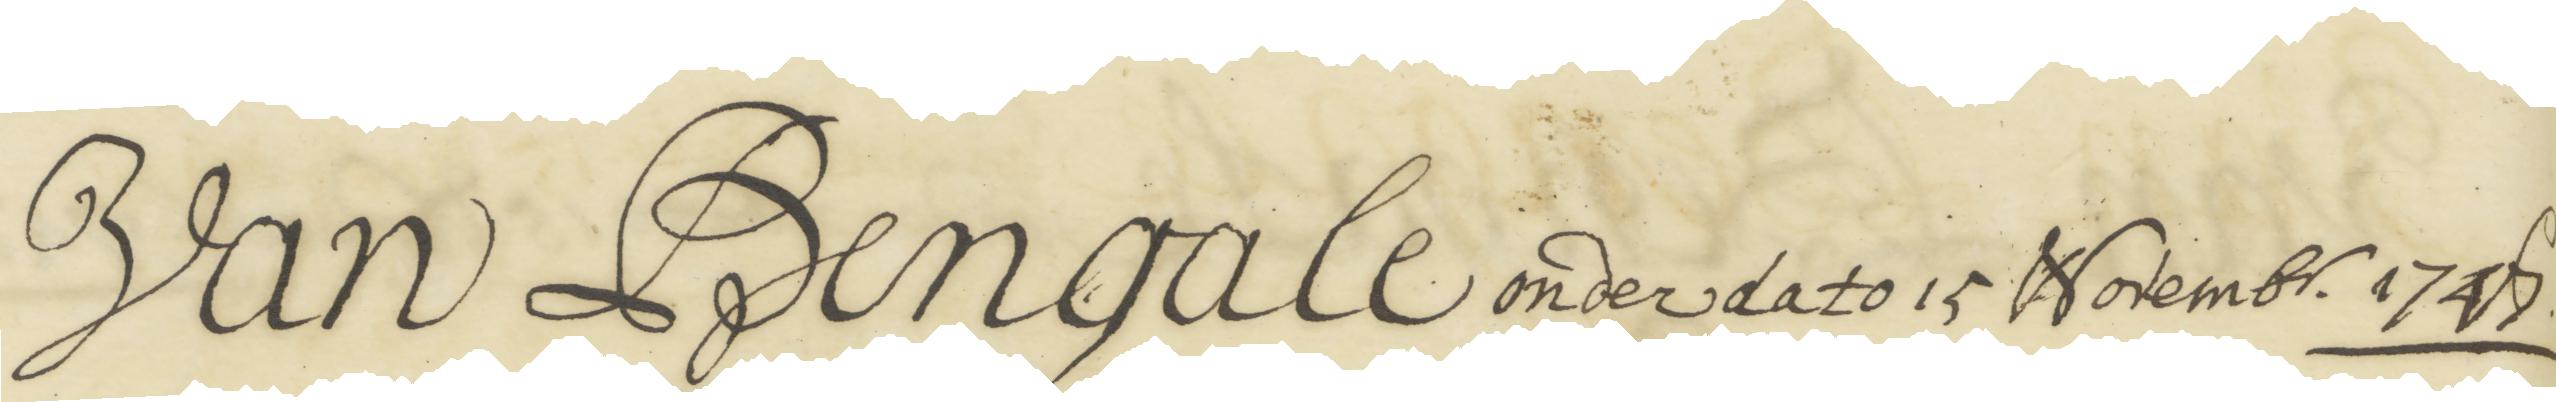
Van Bengale onder dato 15 Novembr. 1746.
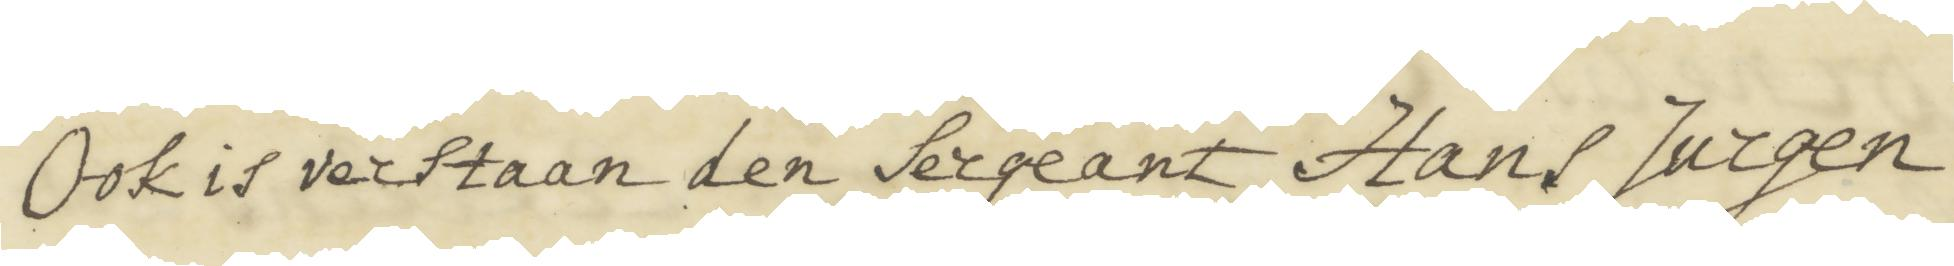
Ook is verstaan den sergeant Hans Jurgen
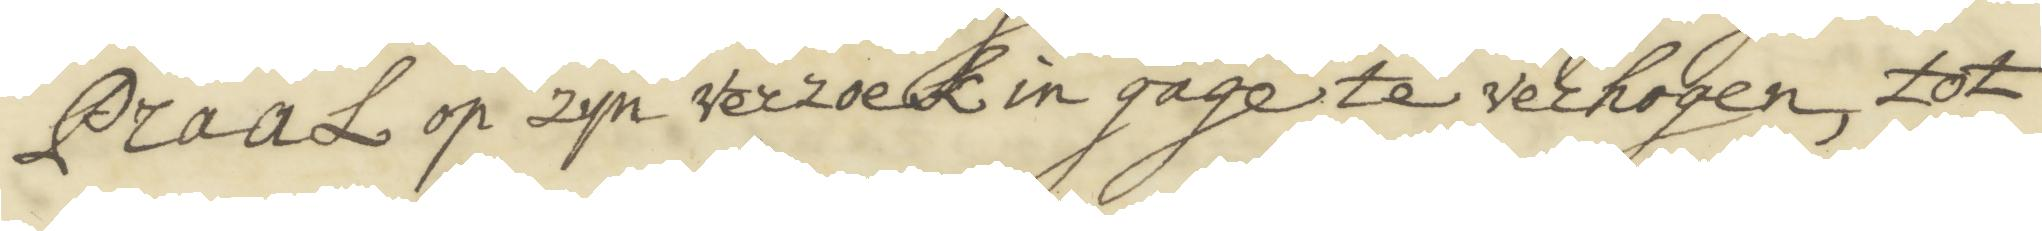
Praal op zyn verzoek in gage te verhogen, tot
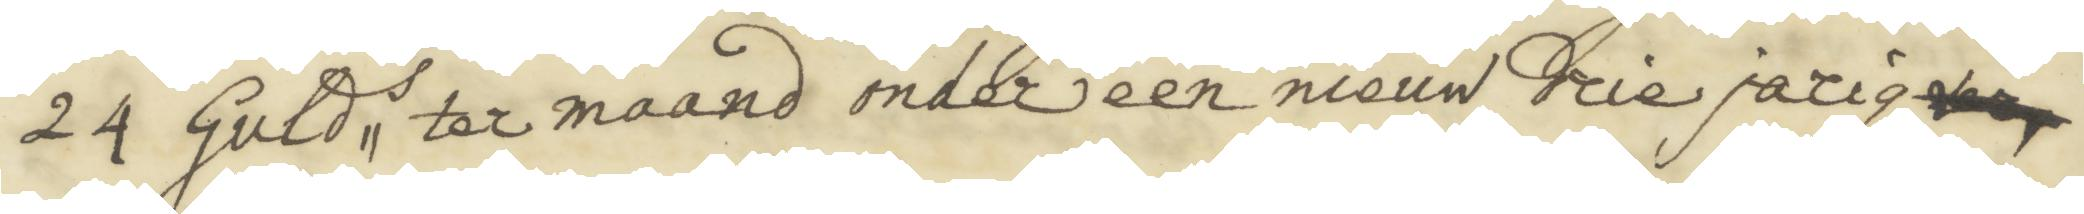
24 Guld„s ter maand onder een nieuw drie jarig ver
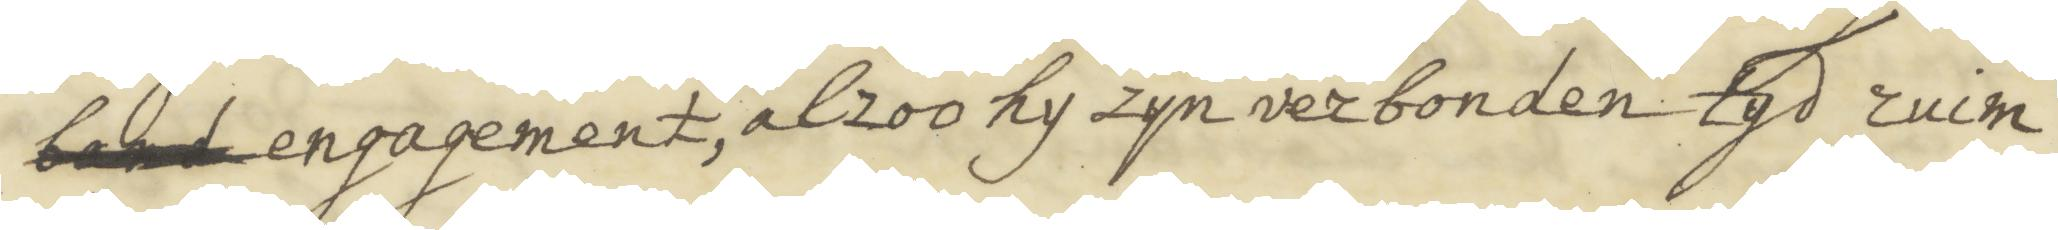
band engagement, alzoo hy zyn verbonden tyd ruim
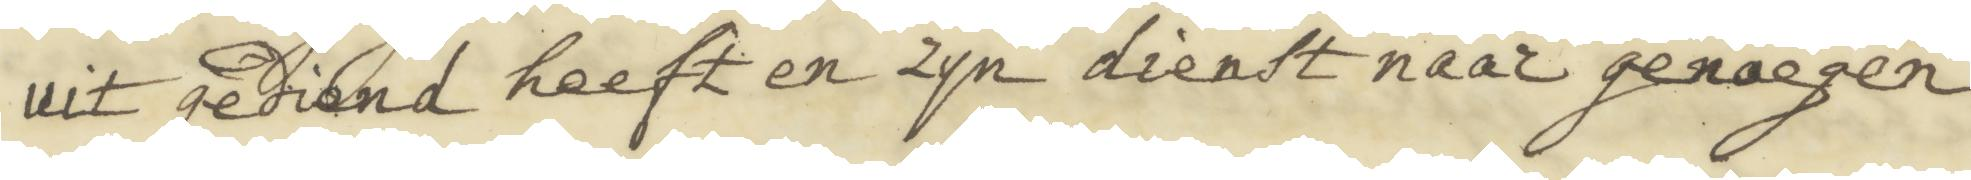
uit gediend heeft en zyn dienst naar genoegen
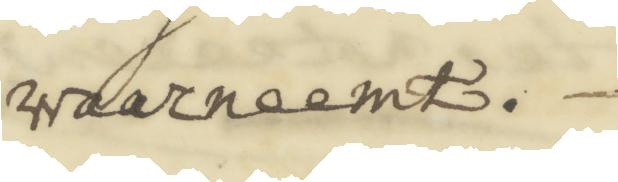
waarneemt. —
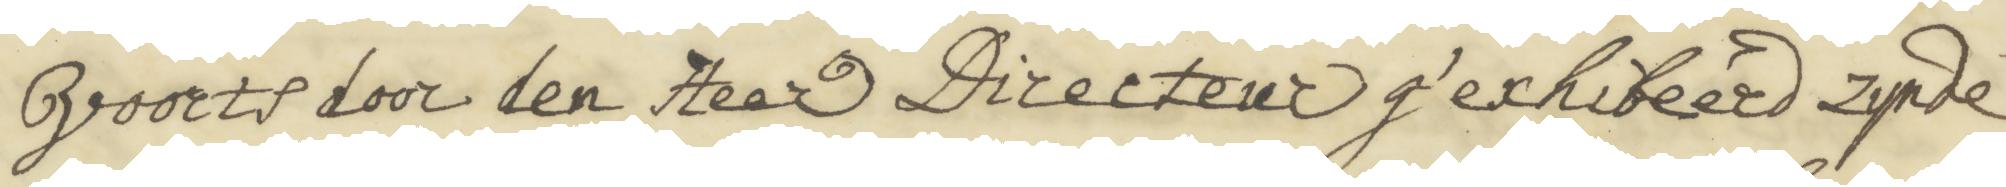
Voorts door den Heer Directeur g’exhibeerd zynde
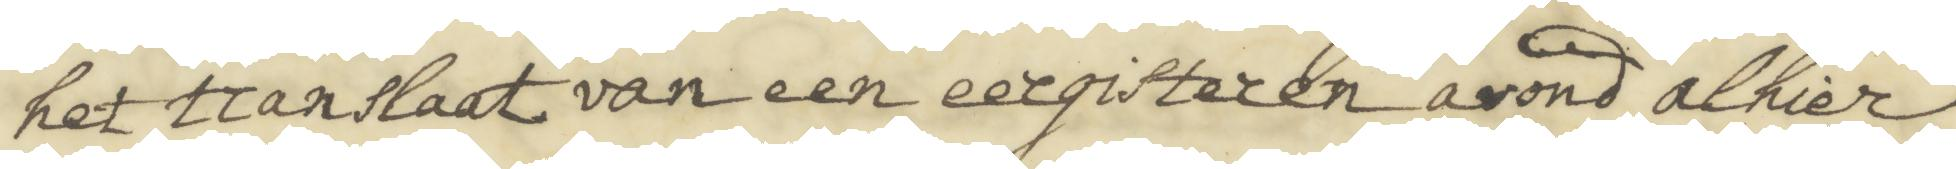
het translaat van een eergisteren avond alhier
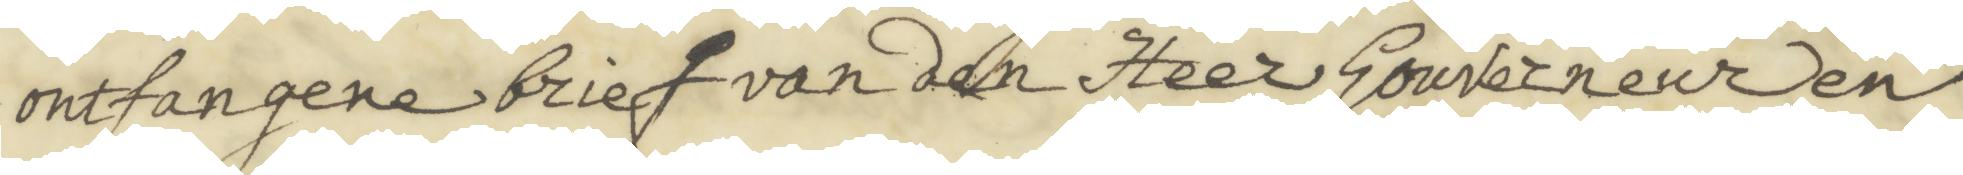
ontfangene brief van den Heer Gouverneur en
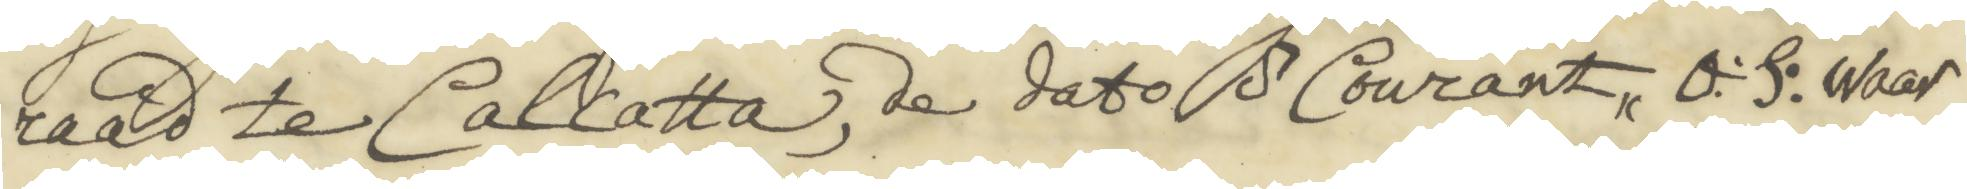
raad te Calcatta, de dato 8 Courant„ O: S: waar
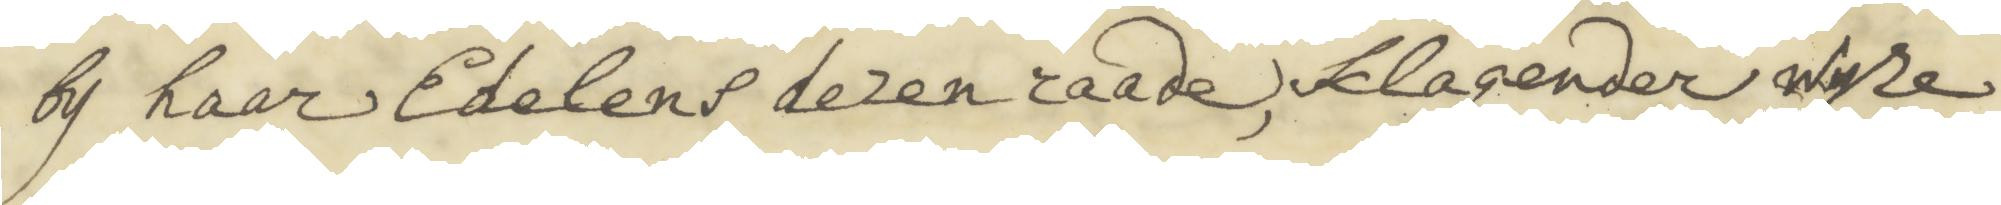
by haar Edelens dezen raade, klagender wyze,
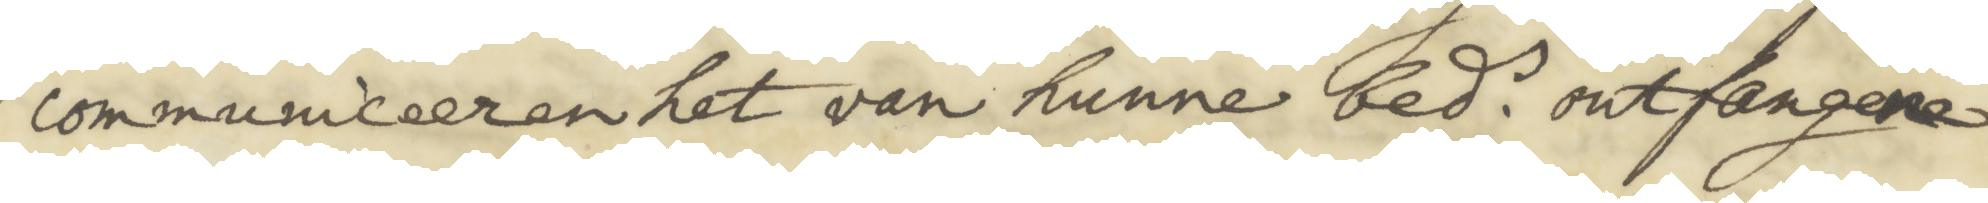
communiceeren het van hunne bed.s ontfangene
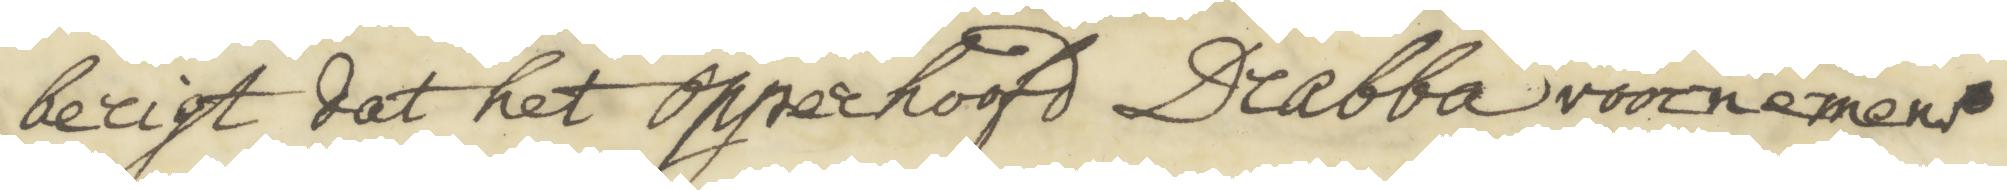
berigt dat het opperhoofd Drabba voornemens
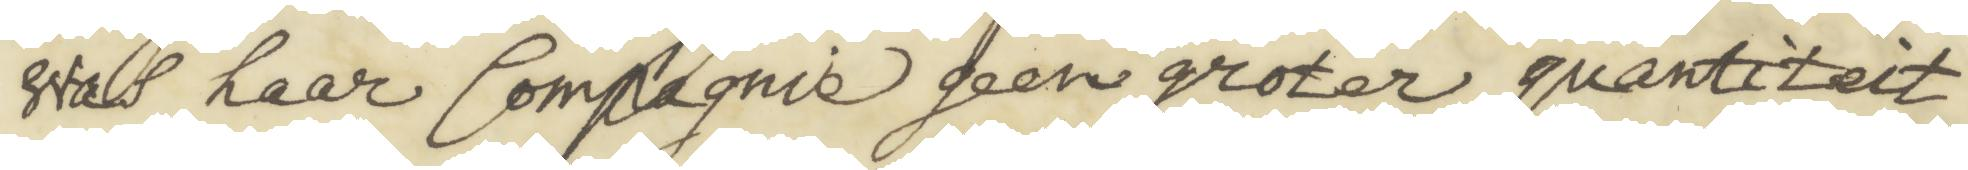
was haar Compagnie geen groter quantiteit
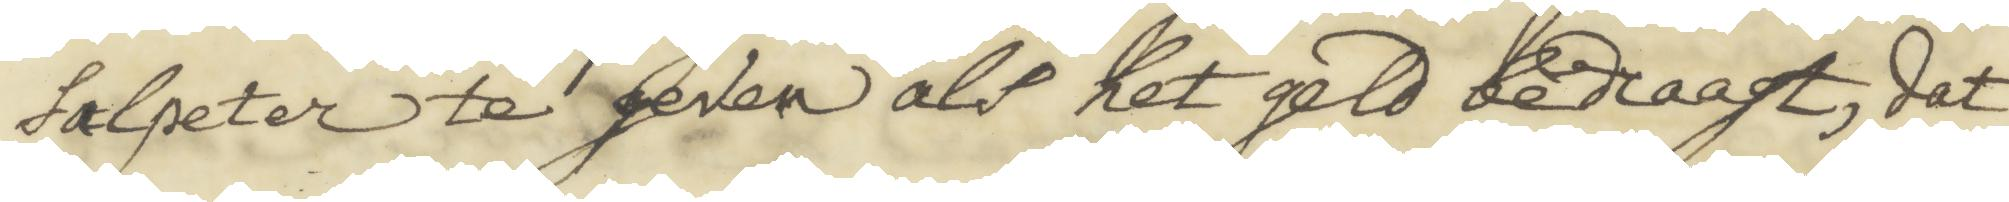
salpeter te geven als het geld bedraagt, dat
